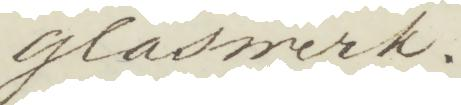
glaswerk.
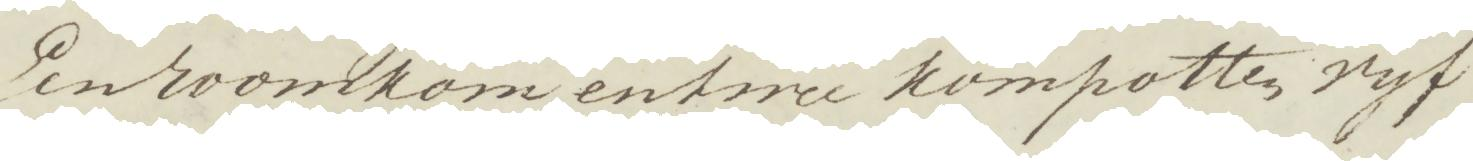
Een roomkom en twee kompotten vijf
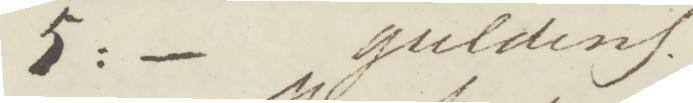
5: — guldens.
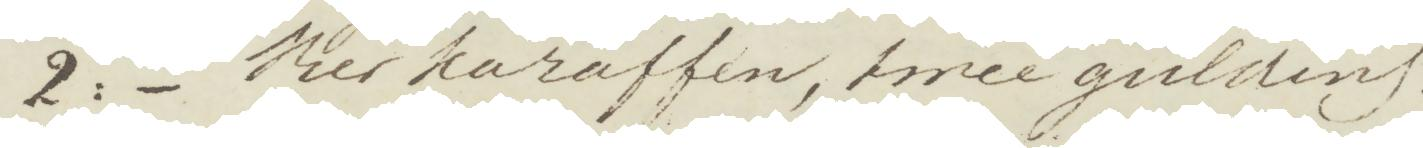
2: — Vier karaffen, twee guldens.
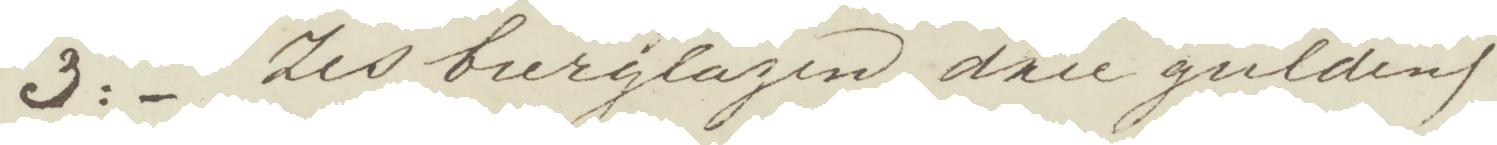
3: — Zes bierijlazen, drie guldens
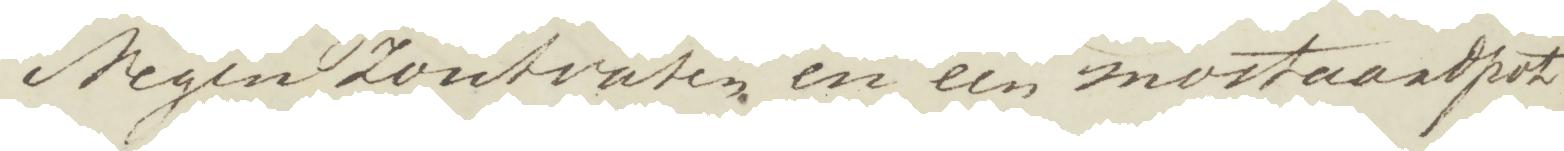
negen zoutvaten en een mostaardpot
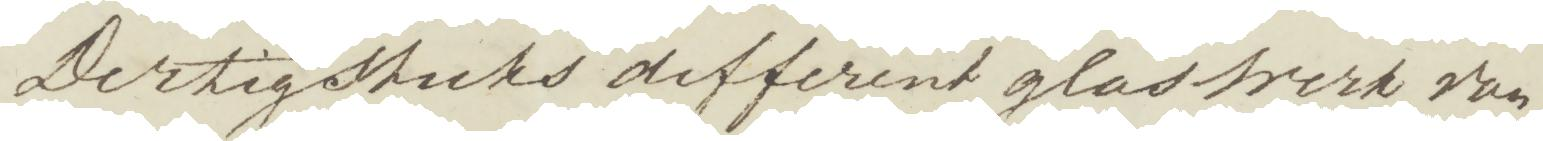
Dertig stuks different glas werk van
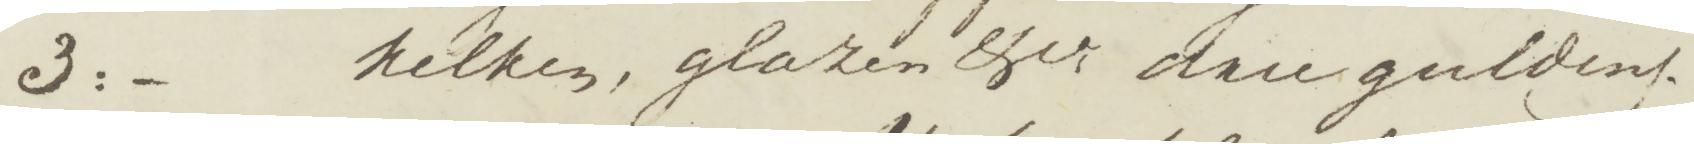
3: — kelken, glazen etc drie guldens.
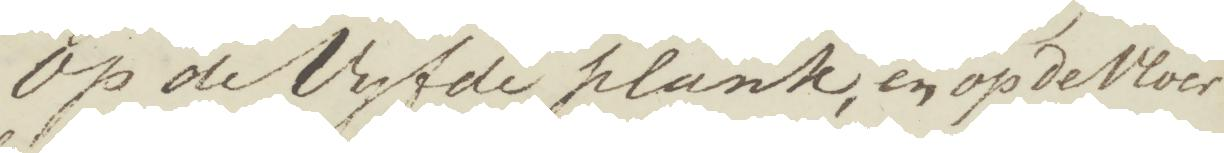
Op de Vijfde plank, en op de Vloer
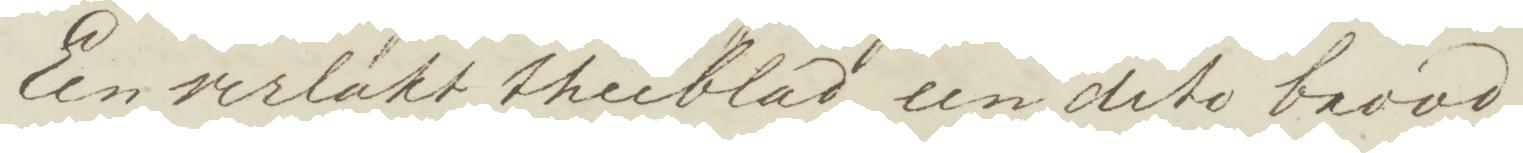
Een verlakt theeblad, een dito brood
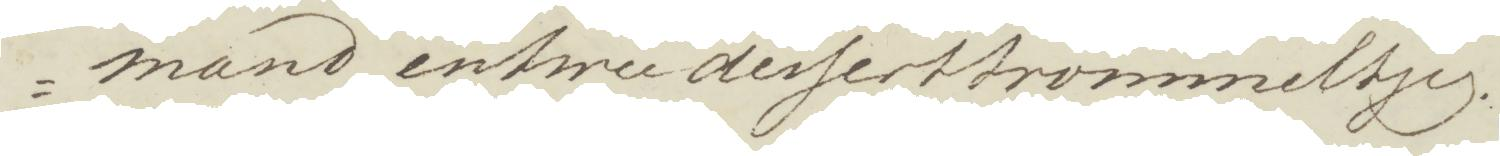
=mand en twee desserttrommeltjes.
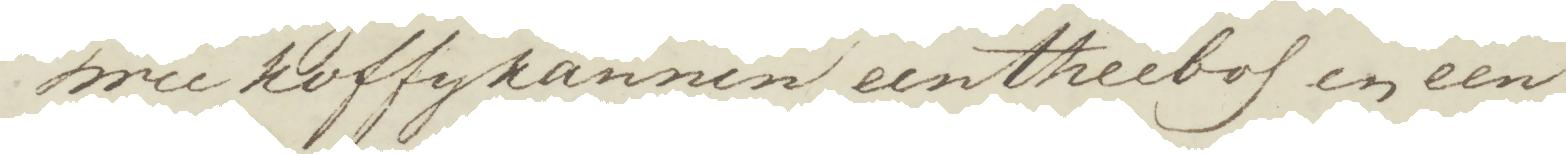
Twee koffijkannen een theebos en een
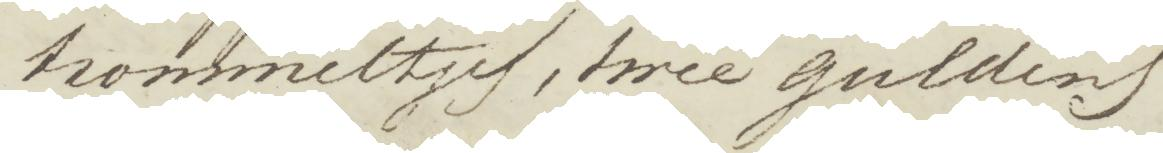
trommeltje , twee guldens.
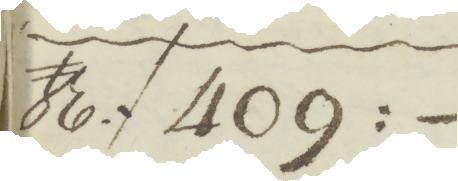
Tr. ƒ409 : —
